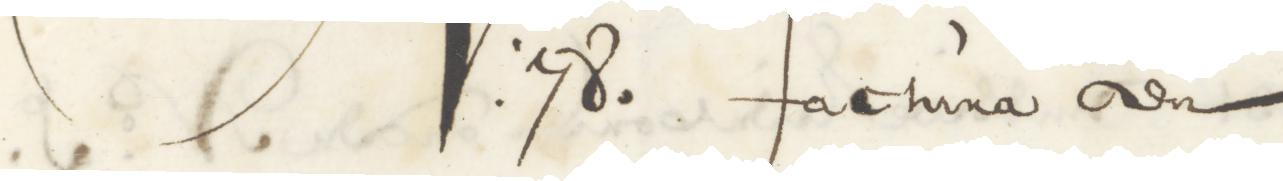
N:o 78. factura en
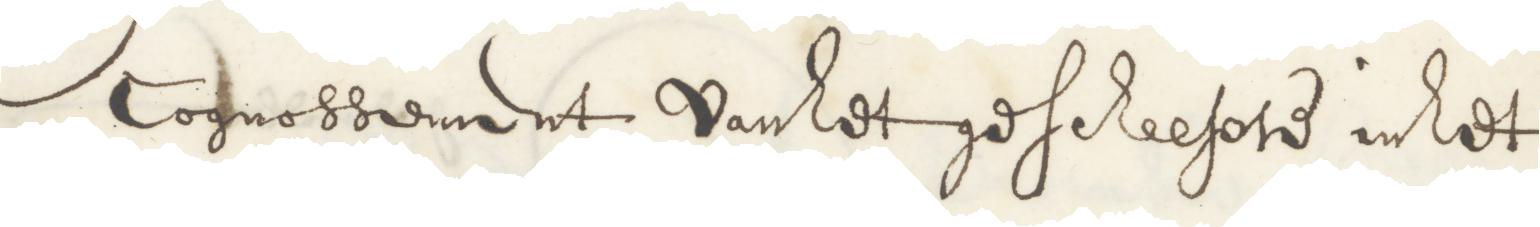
Cognossement van het gescheepte inhet
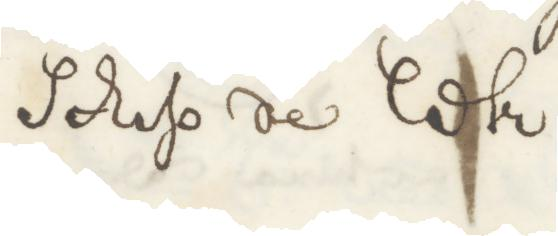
schip de Lek
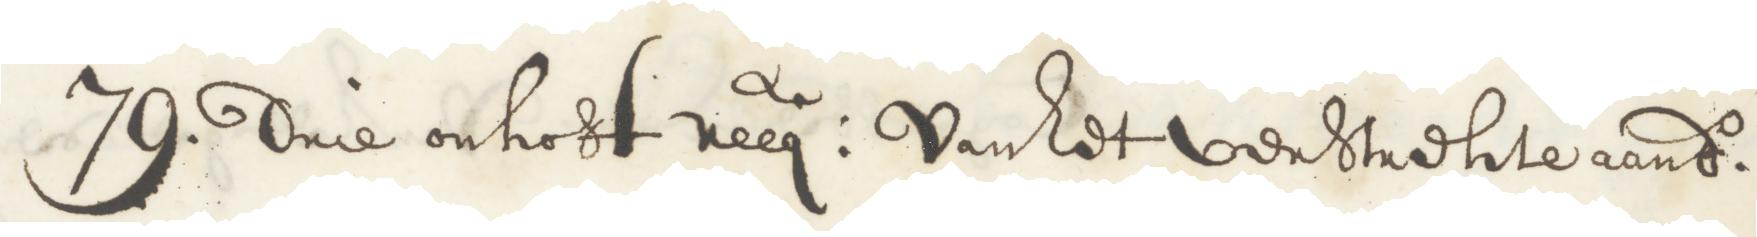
79. drie onkost reeq: van het verstrekte aan d.o
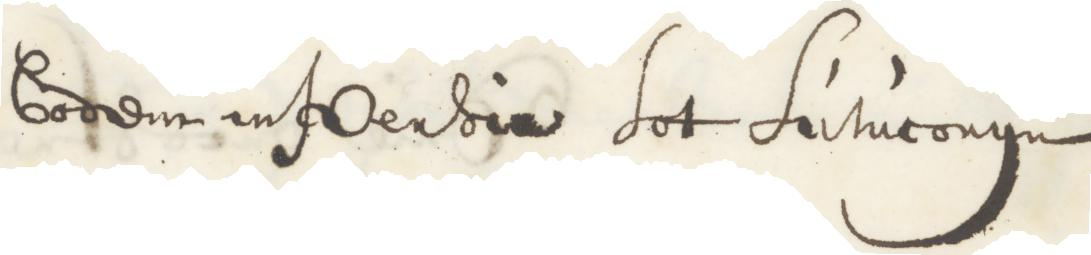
bodem inPersia tot tutucorijn
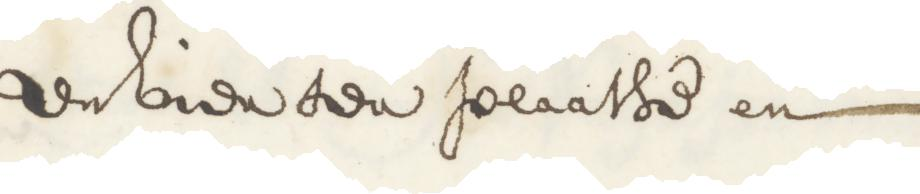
enhier ter plaatse en
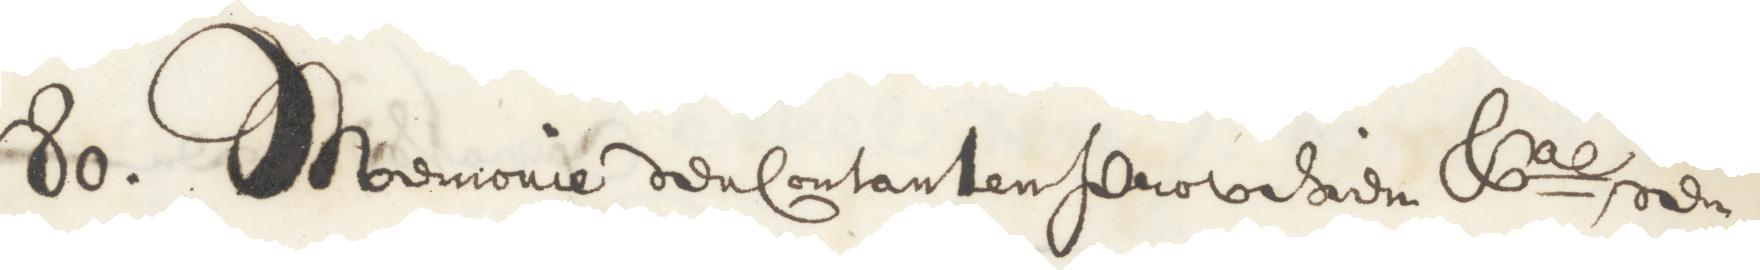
80. Memorie der Contanten Provisien &=al, den
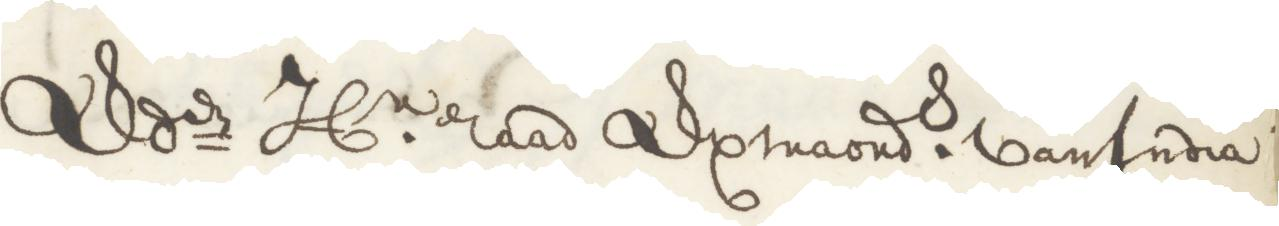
Ed=en H:r raad Extraord.s vanJndia
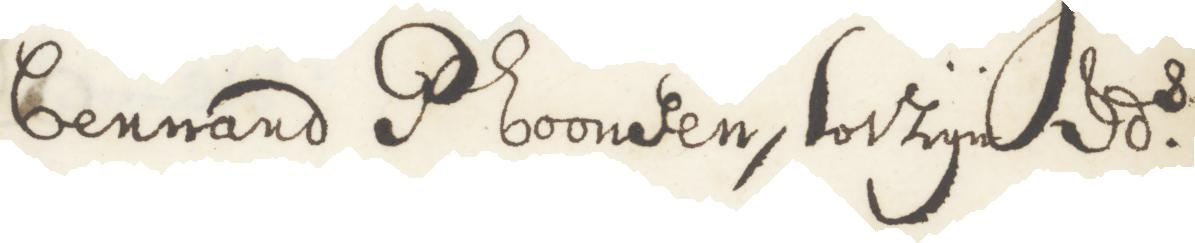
bernard Phoonsen, totzijn Ed:s
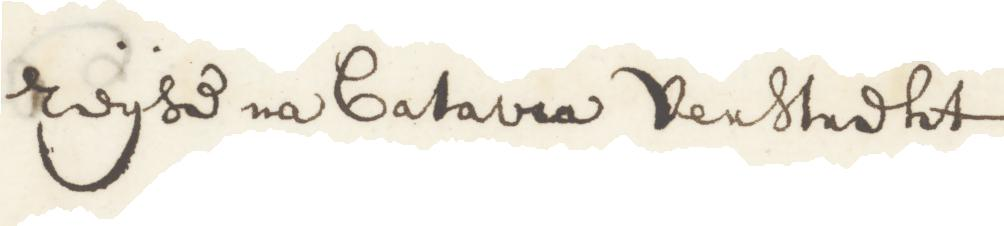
reijse na batavia verstrekt
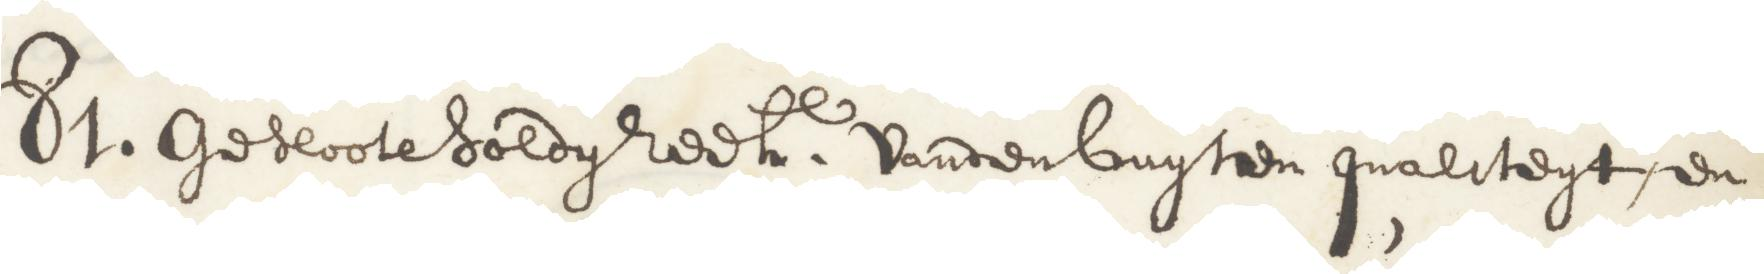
81. gesloote soldijreek.e vanden buijten qualiteijt, en
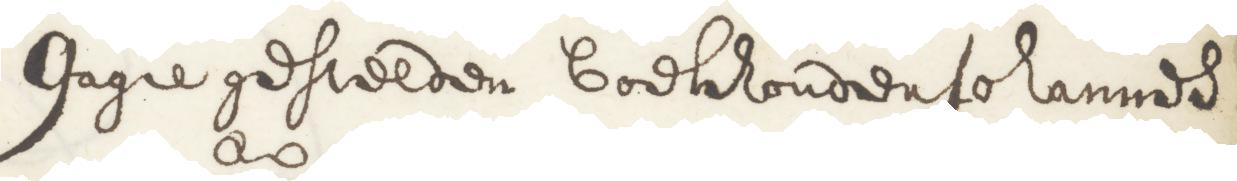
Gagie gestelden boekhouder Johannes
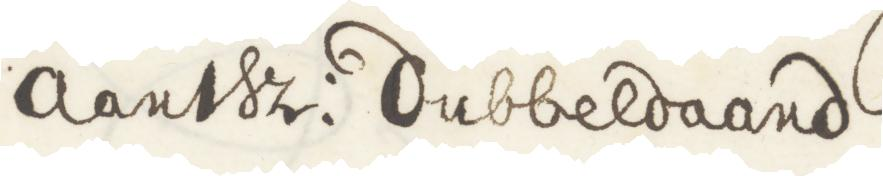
aartsz: dubbeldaard
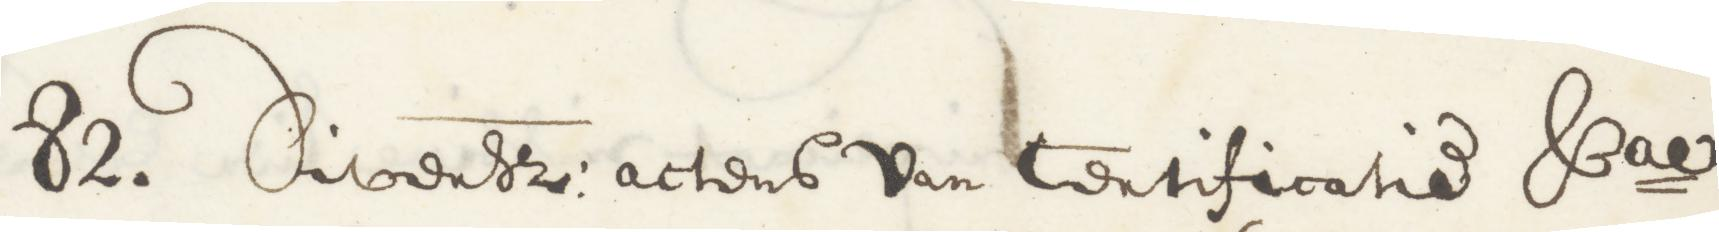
82. Diversz: actens van Certificatie &=ae
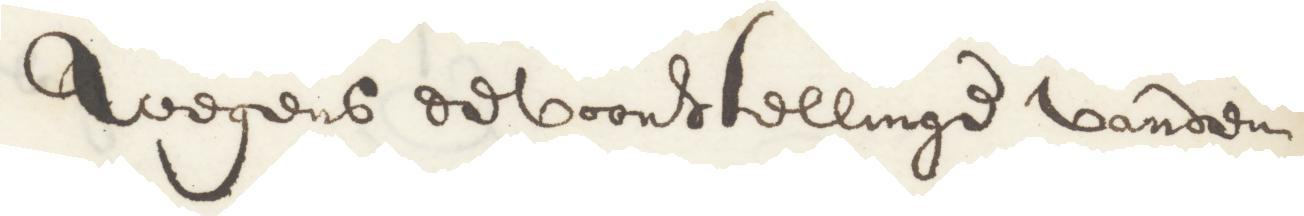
wegens de voorstellinge vanden
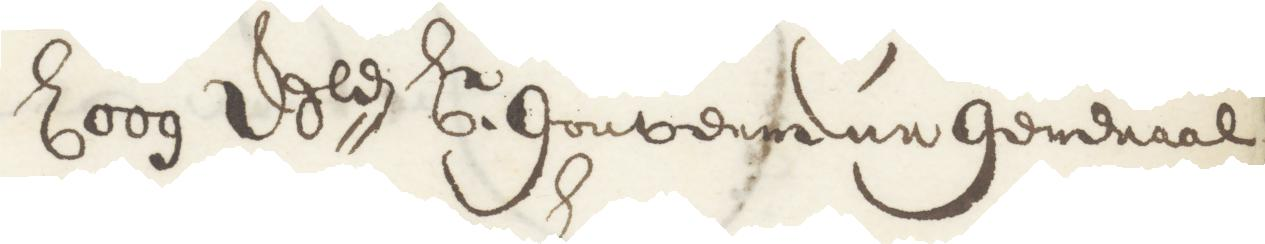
Hoog Ed„le h:r Gouverneur generaal
